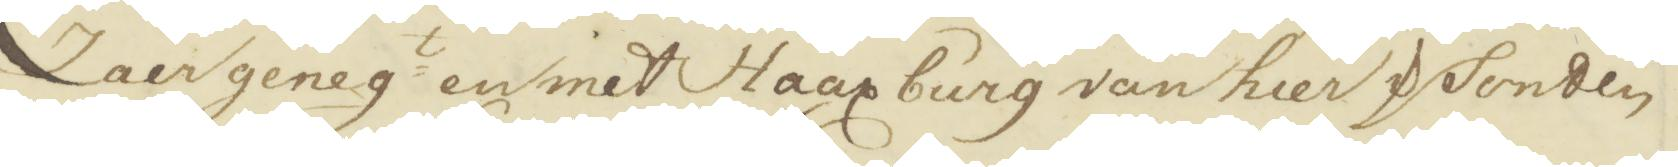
Zaer geneg:t en met Haaxburg van hier Versonden
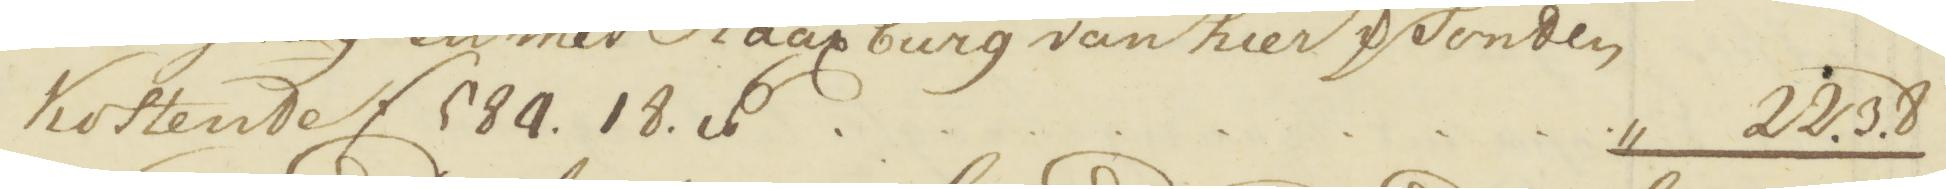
Kostende ƒ 584. 18. is . . . . . . . . „ 22.3.8
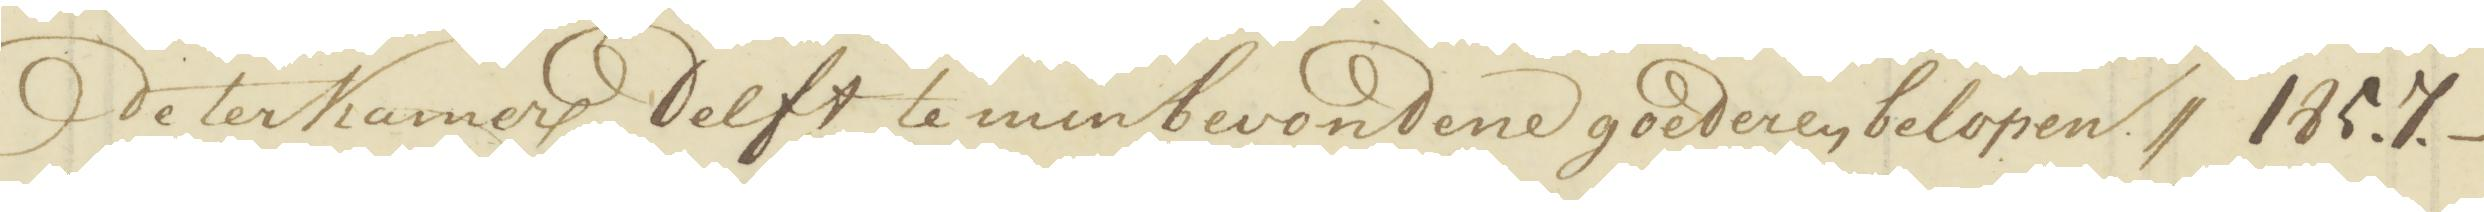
de ter Kamer Delft te min bevondene goederen belopen. „ 185.7.—
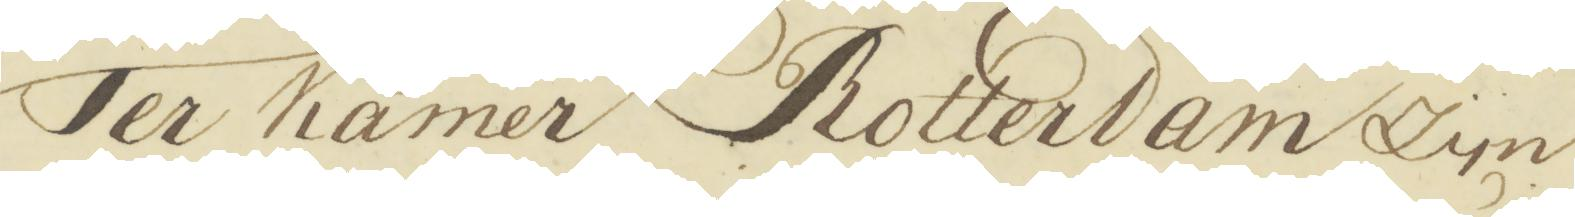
Ter Kamer Rotterdam zijn
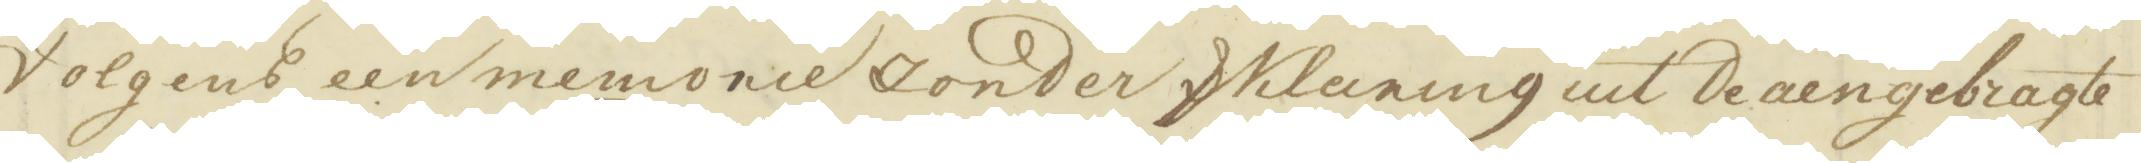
volgens een memorie zonder verklaring uit de aengebragte
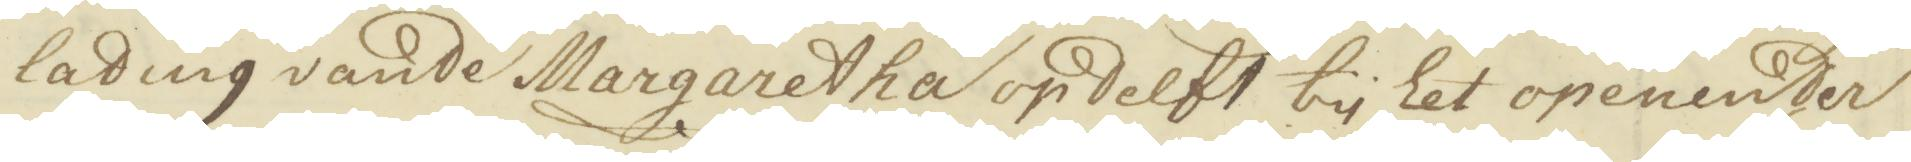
lading van de Margaretha op Delft bij het openen der
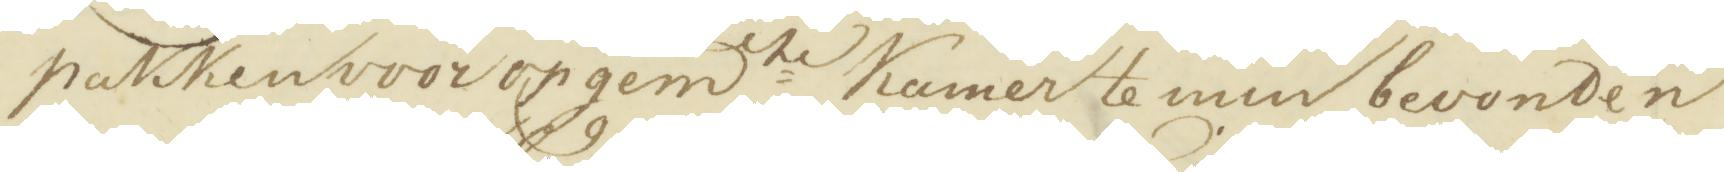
pakken voor opgem:te Kamer te min bevonden
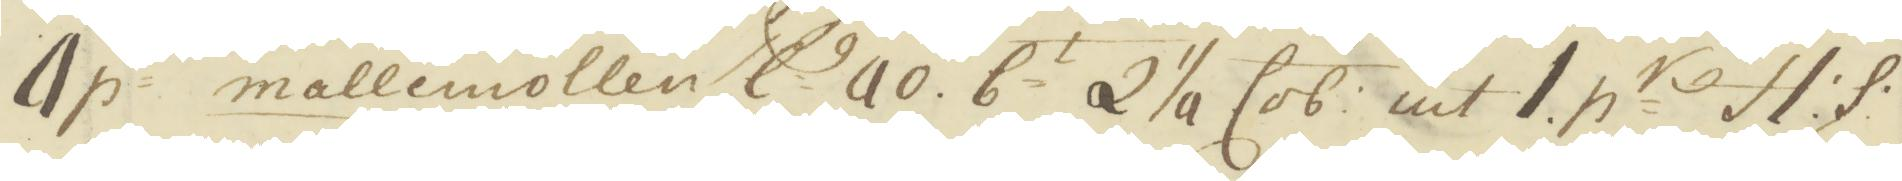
4 p:s mallemollen l=g 40. b=t 2¼ Cob: uit 1. p=k H: S:
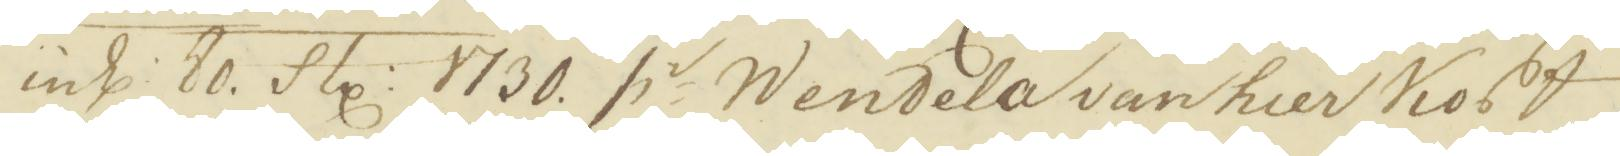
inh: 80. Stx: 1730. p:r Wendela van hier Kost
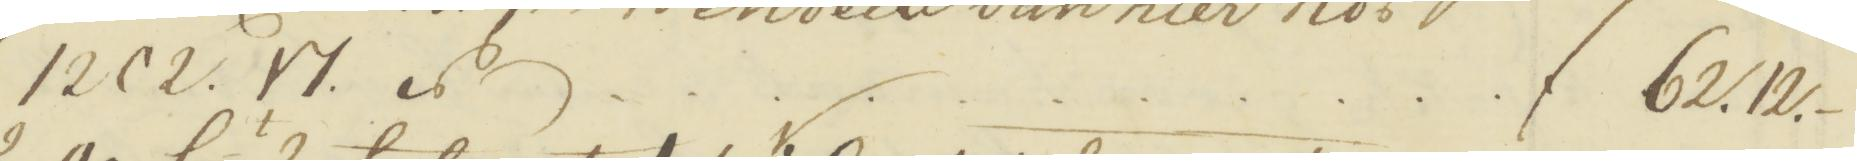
1202. 17. is . . . . . . . . . . . . . ƒ 62. 12.
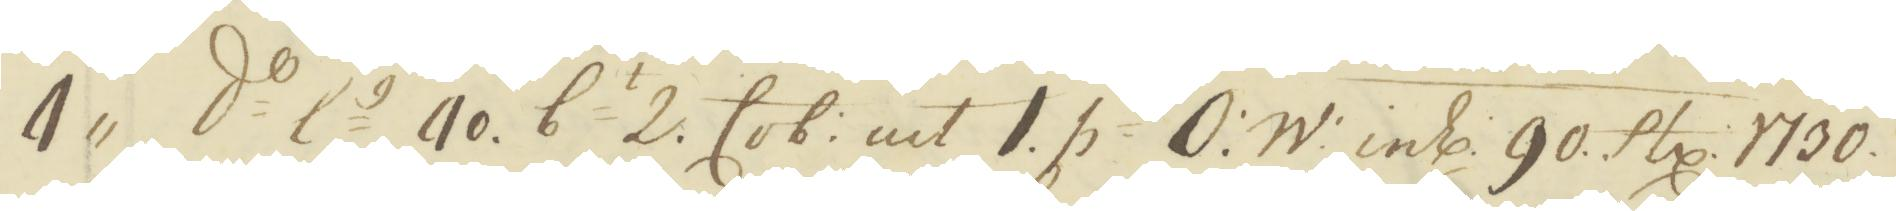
4 „ d:o l=g 40. b=t 2: Cob: uit 1. p:k O: W: inh: 90: Stx: 1730.
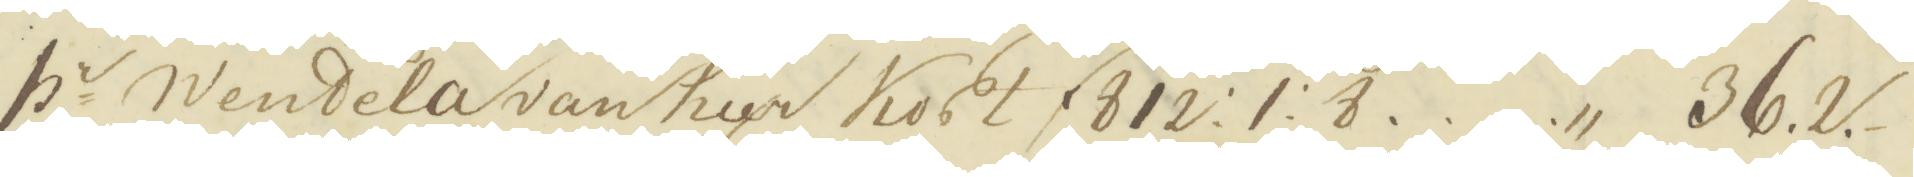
p:r Wendela van hier Kost ƒ 812:1:8. . . . „ 36.2.-
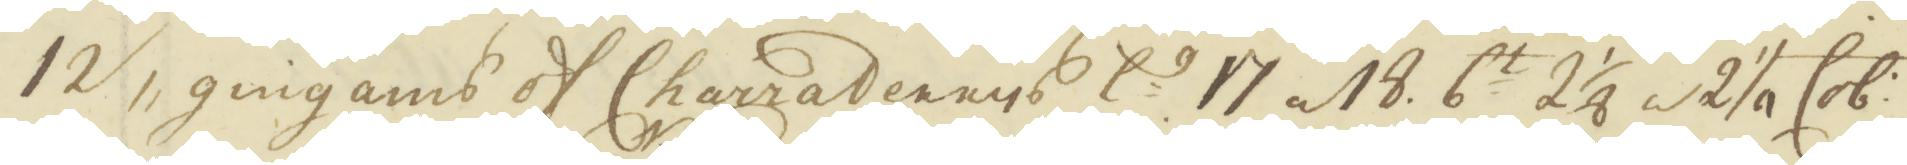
12 „ gingams of Charraderrijs l:g 17 a18. b:t 2 1/8 a 2¼ Cob:
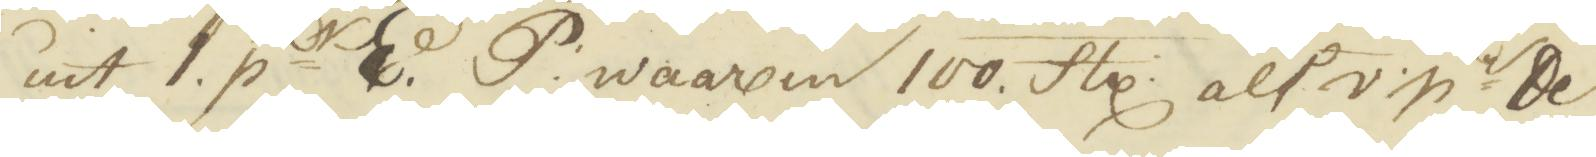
uit 1. p=K E. P: waarin 100. stx: als v: p:r De
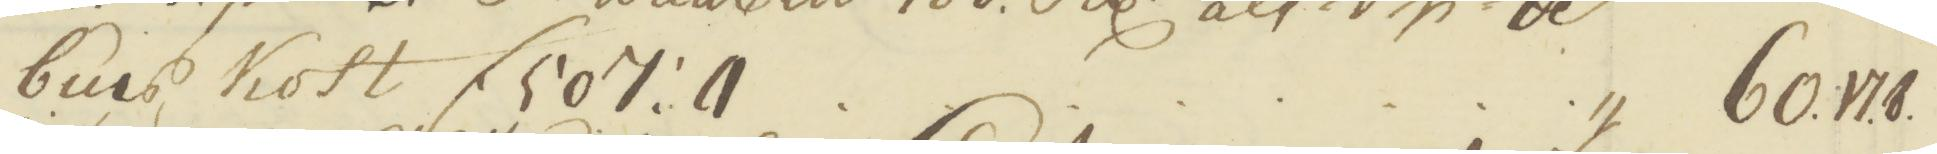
buis Kost ƒ 507:4 . . . . . . . . „ 60.17.8.
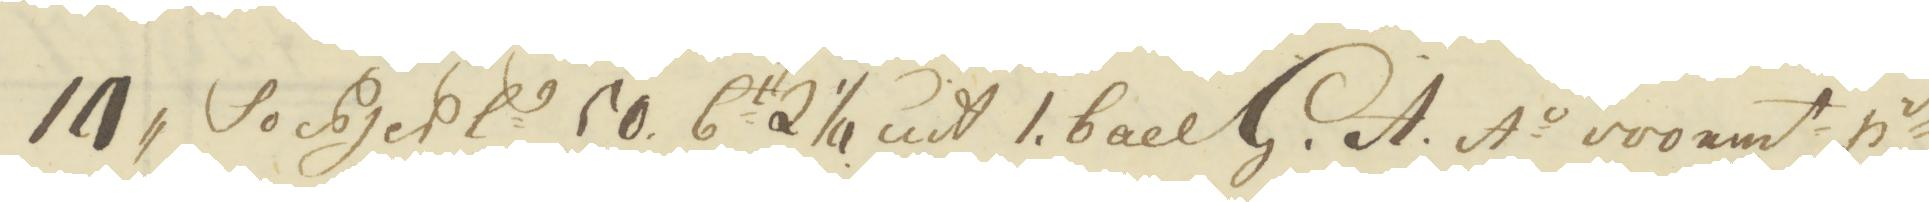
14 „ Soesjes l=g 50. b:t 2¼ uit 1: bael G. A. A:o voorm:t p:r
